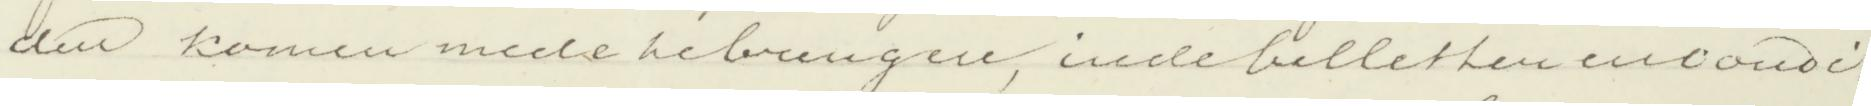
den komen mede tebrengen, indebilletten encondi
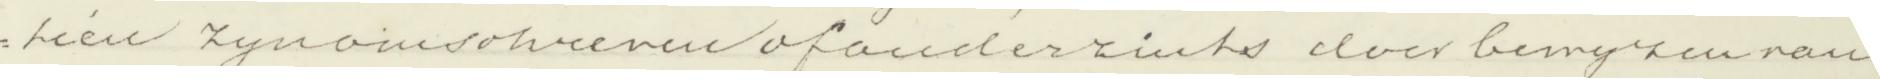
=tien zynomschreven of anderzints door bewyzen van
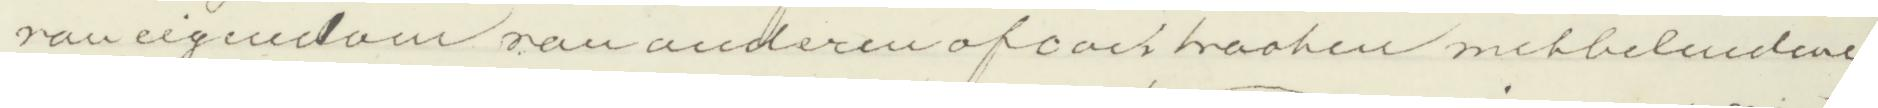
van eigendom van anderen ofcontracten met belendenen
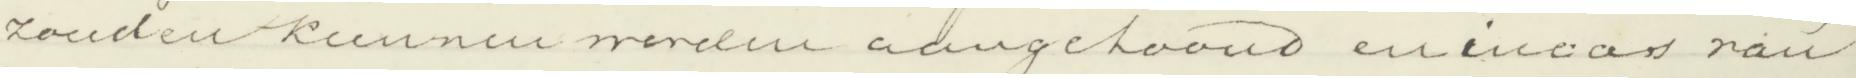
zouden kunnen worden aangetoond en incas van
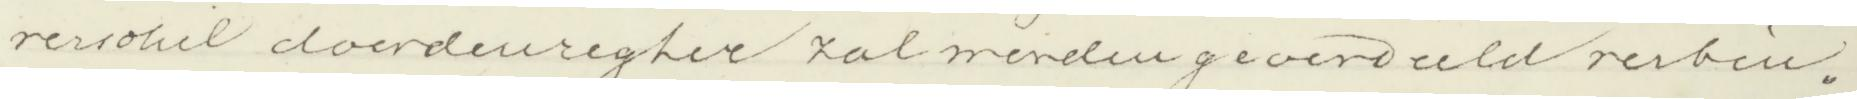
verschil doordenregter zal worden geoordeeld verbin„
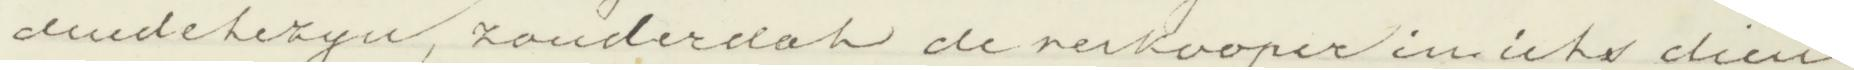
dendetezyn, zonderdat de verkooper in iets dien
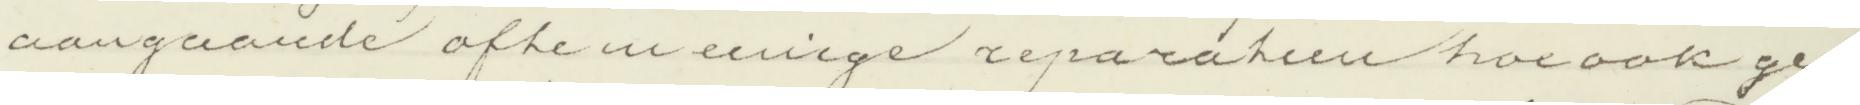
aangaande ofte in eenige reparatien hoe ook ge
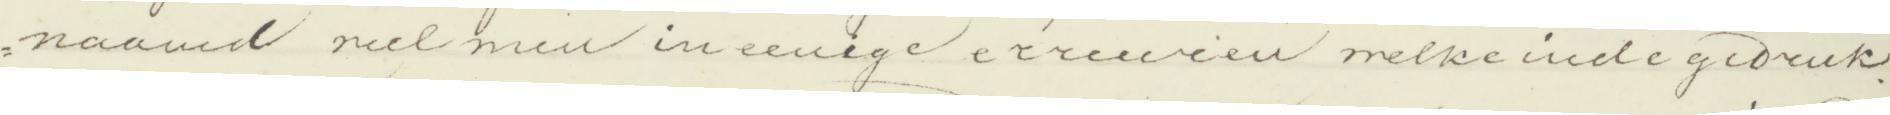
=naamd veel min in eenige erreuren welke inde gedruk
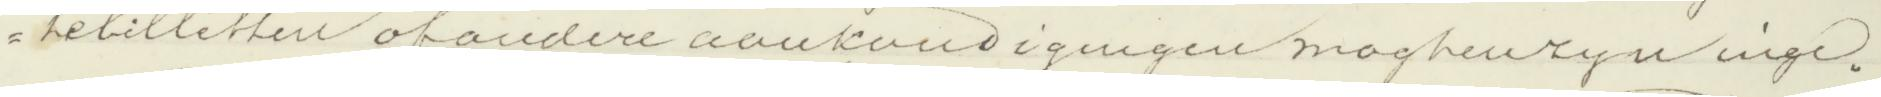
=tebilletten ofandere aankondigingen mogtenzyn inge„
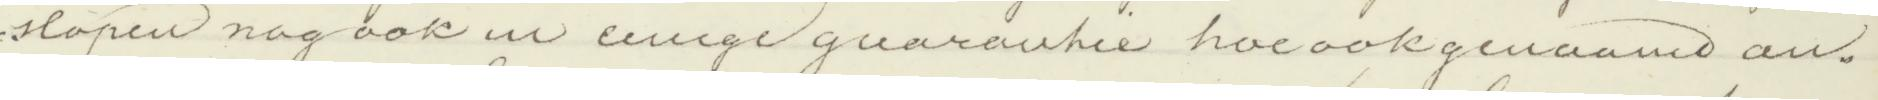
„slopen nog ook in eenige guarantie hoe ook genaamd an„
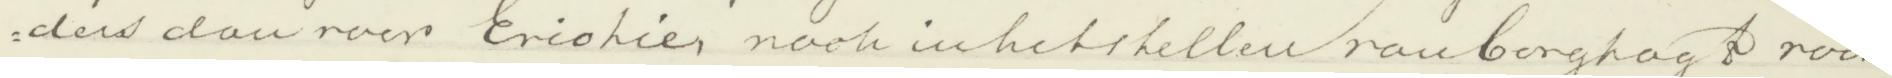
=ders dan voor Evictien, noch inhetstellen vanborgtogt voor
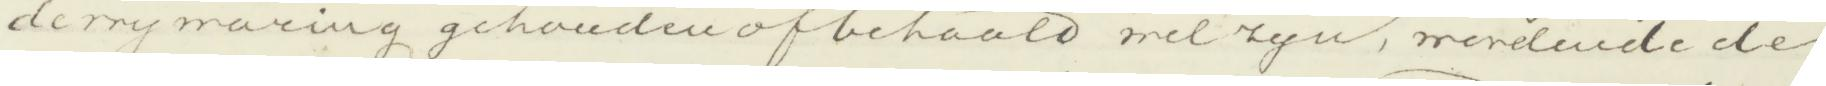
de vrywaring gehouden ofbehaald wel zyn, wordende de
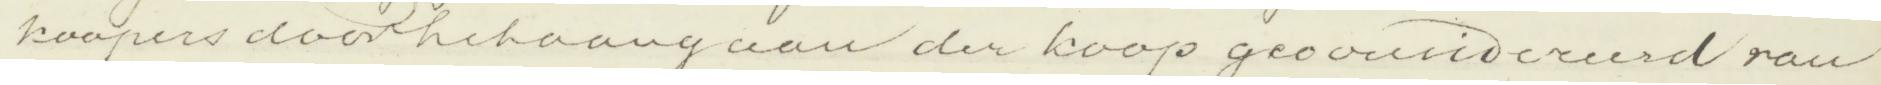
koopers door hetaangaan der koop geconsidereerd van
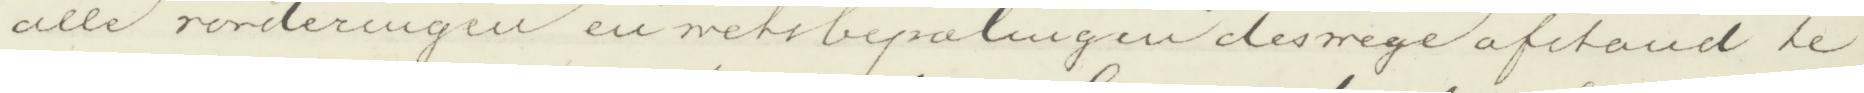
alle vorderingen en wetsbepalingen deswege afstand te
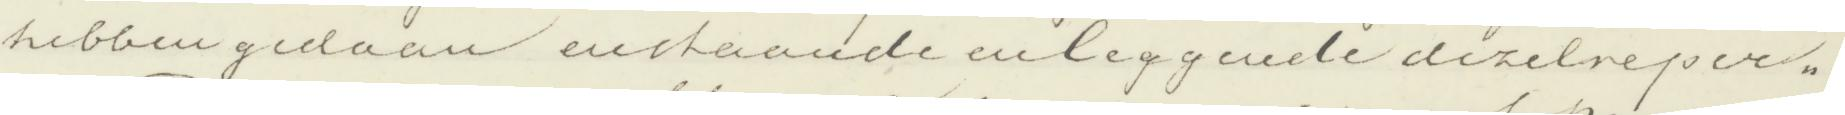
hebben gedaan enstaande enleggende dezelveper„
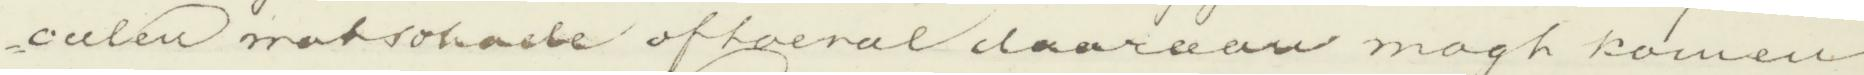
=ceelen watschade oftoeval daaraan mogt komen
